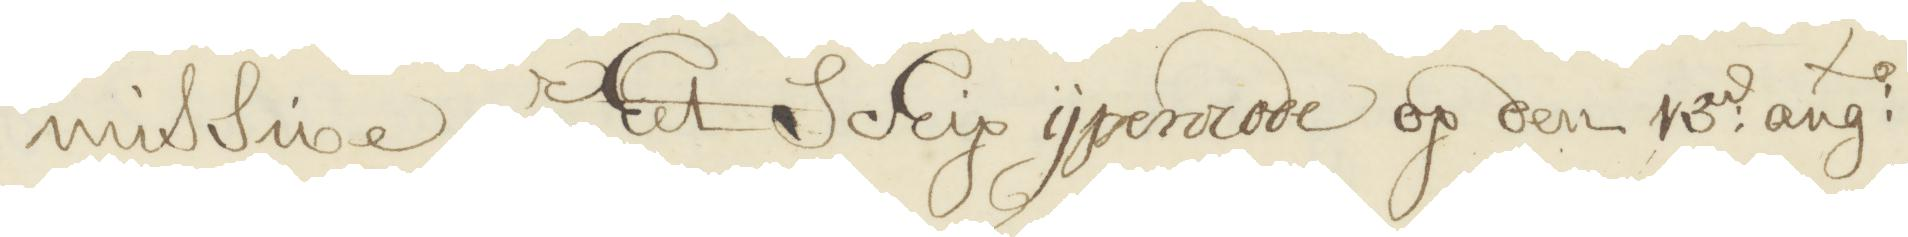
missive p:r het schip ijpenrode op den 13:e aug:o
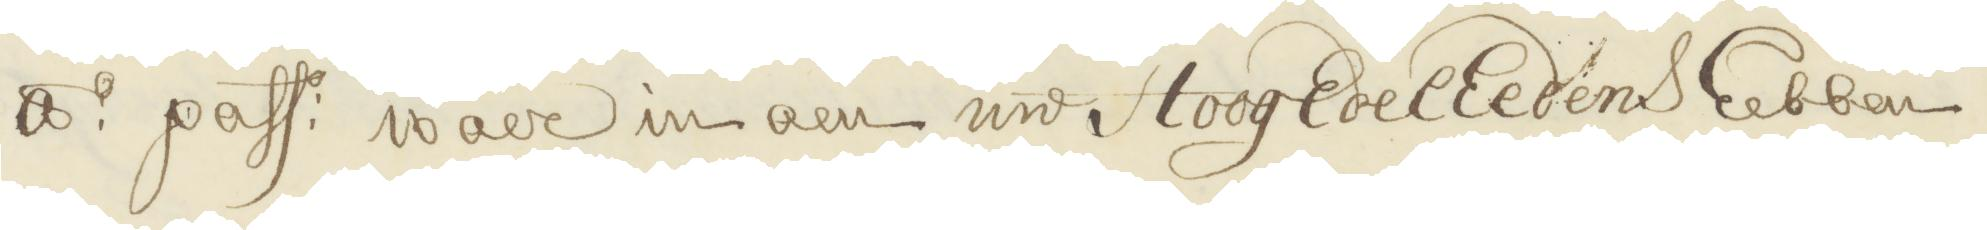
a:o pass:o waer in aen uw Hoog Edel hedens hebben
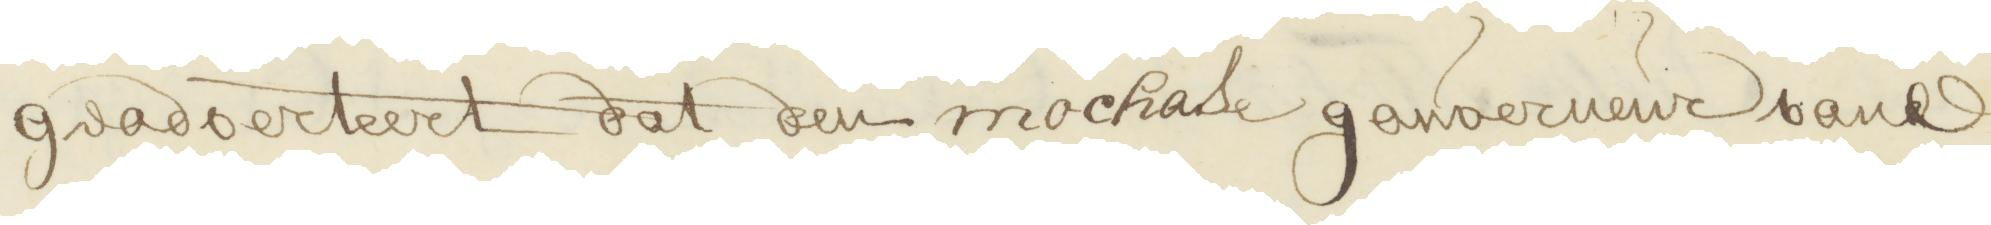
geadverteert dat den mochase gouverneur vande
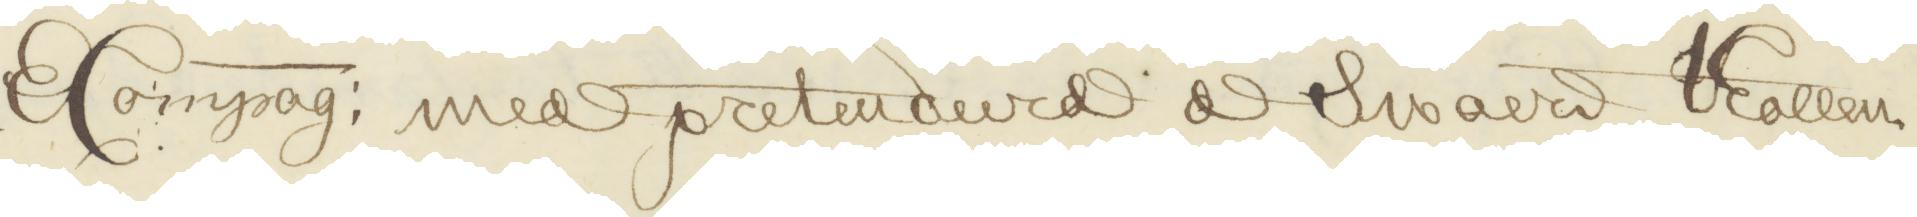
ECompag: mede pretendeerde de swaere thollen
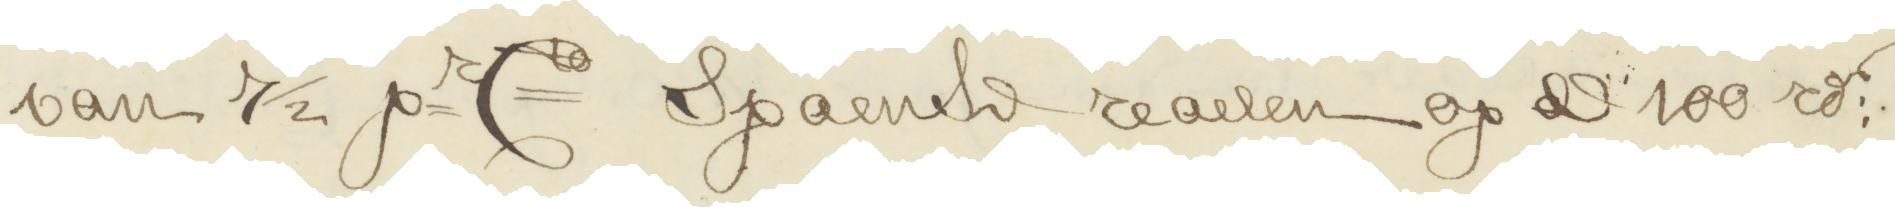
van 7½ p=rC=to spaense reaelen op de 100 rd:s
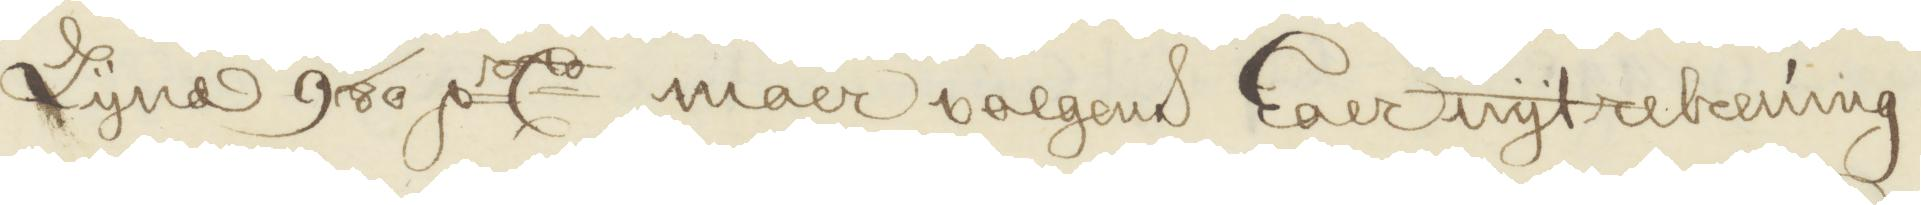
zijnde 9 9/80 p=rC=to maer volgens haer uijt rekening
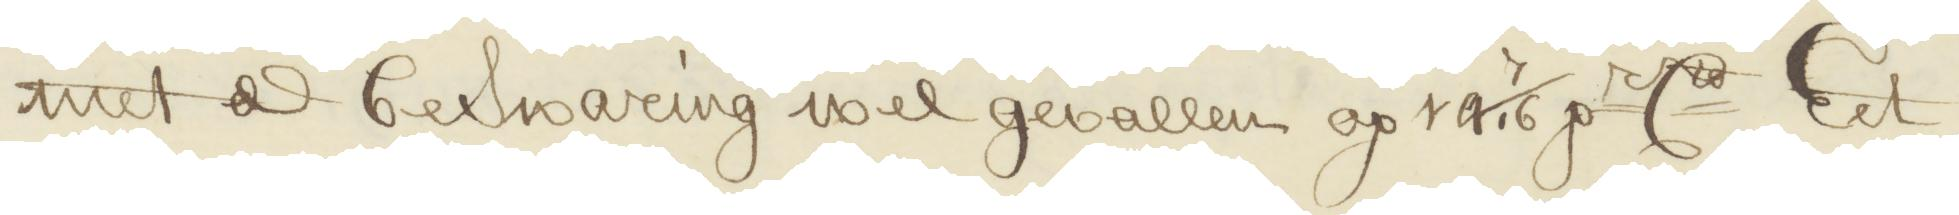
met de beswaring wel gevallen op 14 7/16 p=rC=to het
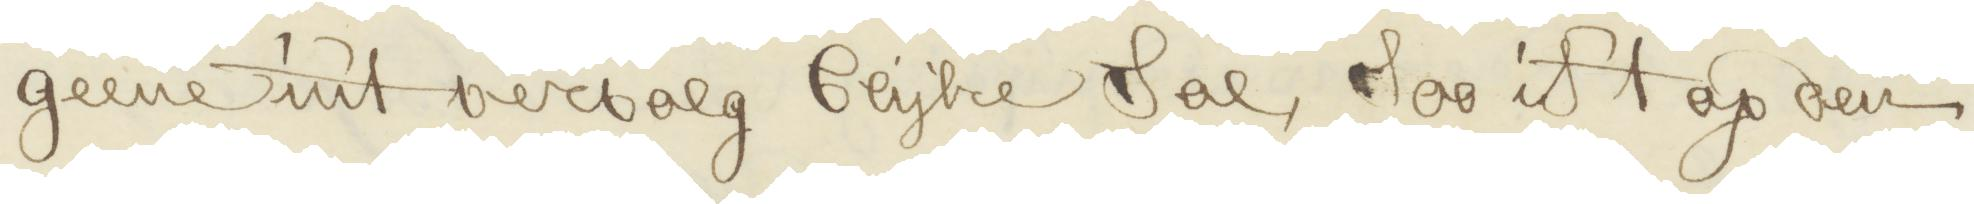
geene in’t vervolg blijke sal, soo is ’t op den
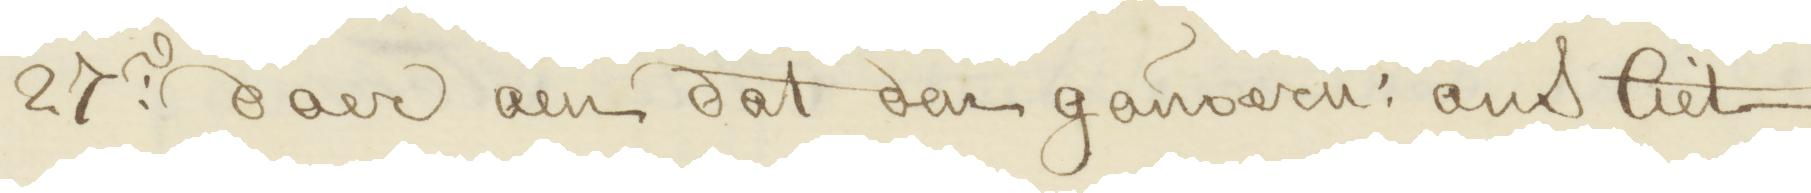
27:e daer aen dat den gouvern:r ons liet
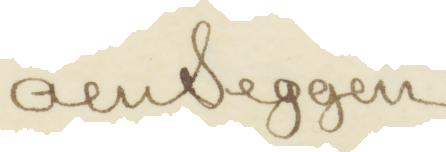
aenseggen
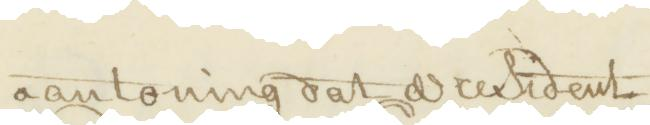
aantoning dat de resident
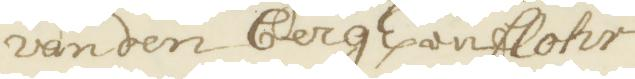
van den berghenflohr
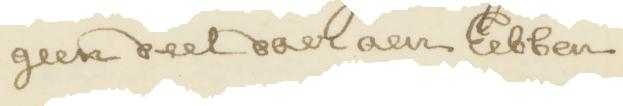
geen deel daer aen hebben
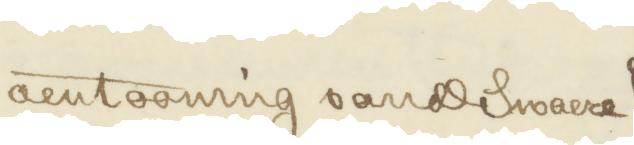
aentooning van de swaere
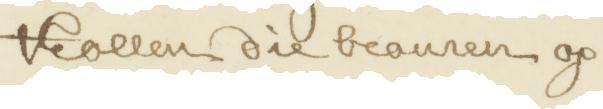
thollen die komen op
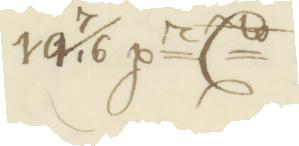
14 7/16 p=rC=to
